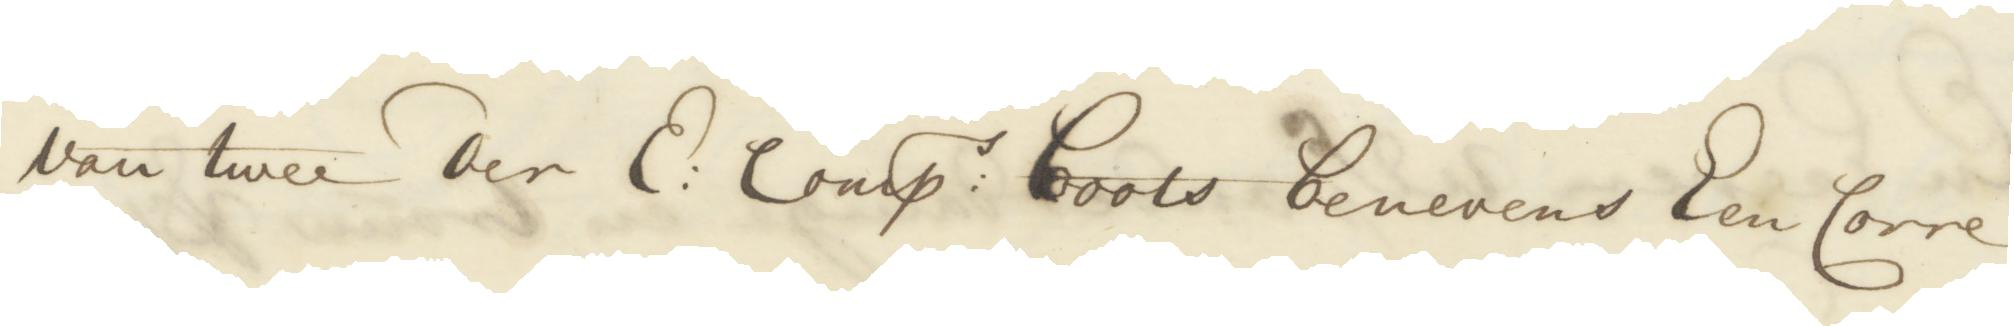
van twee der E: Comp:s boots benevens Een Corre
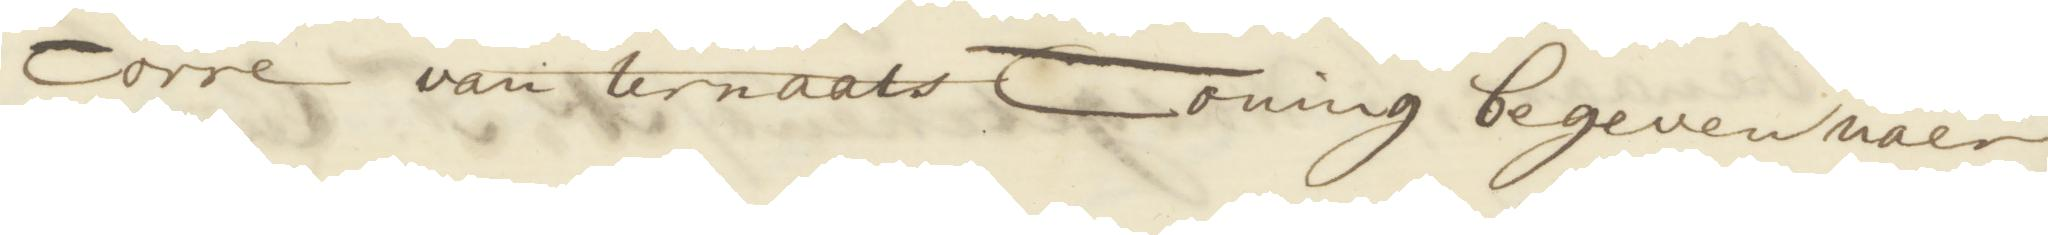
corre van ternaats Coning begeven naer
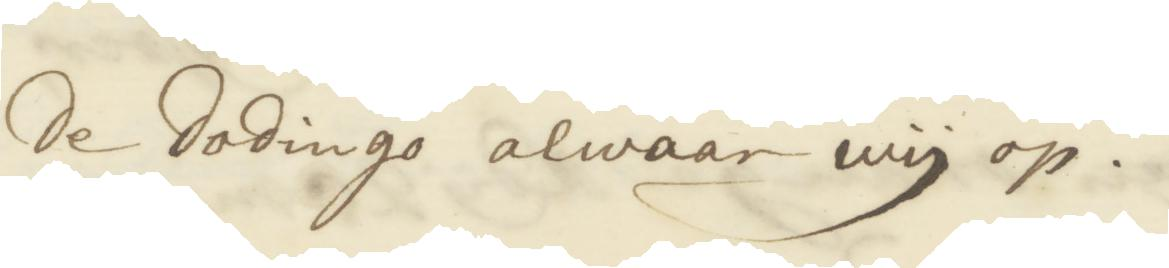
de dodingo alwaar wij op.
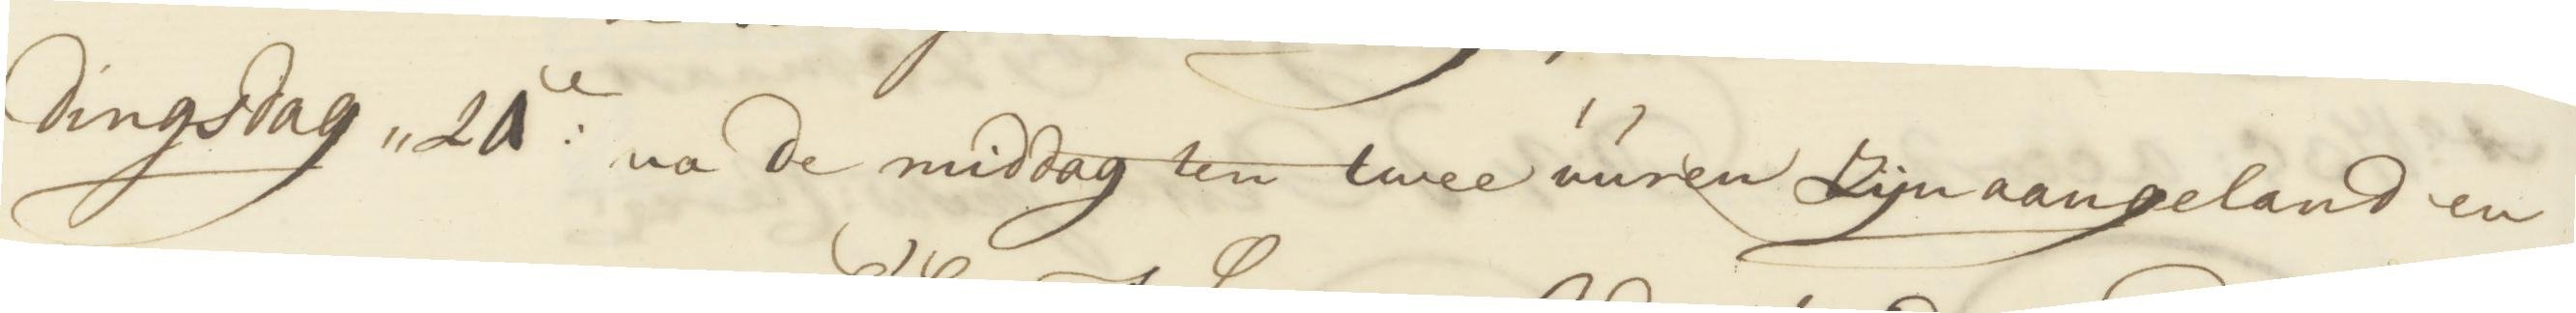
dingsdag „ 24:e na de middag ten twee uuren zijn aangeland en
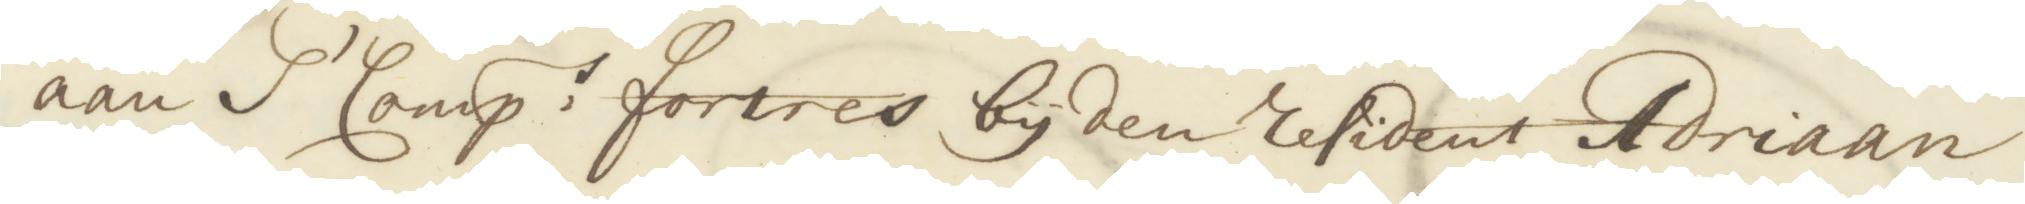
aan s'Comp:s fortres bij den resident Adriaan
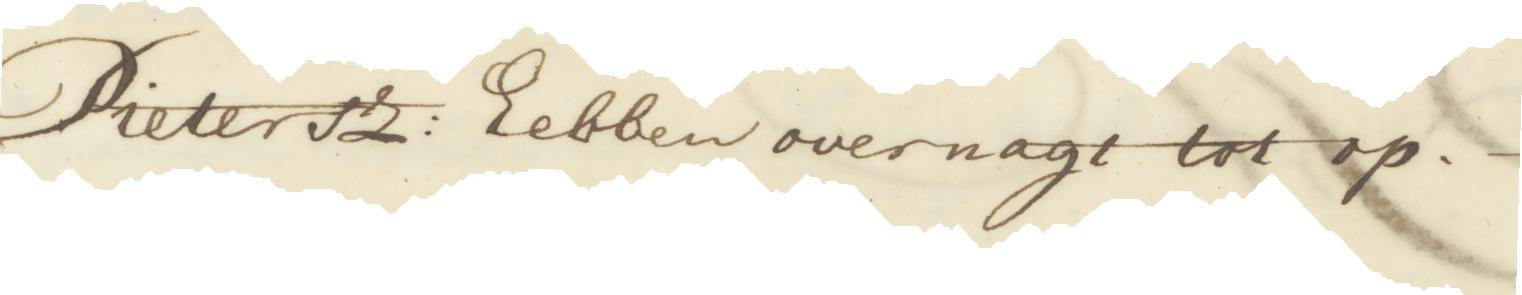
Pietersz: hebben overnagt tot op.
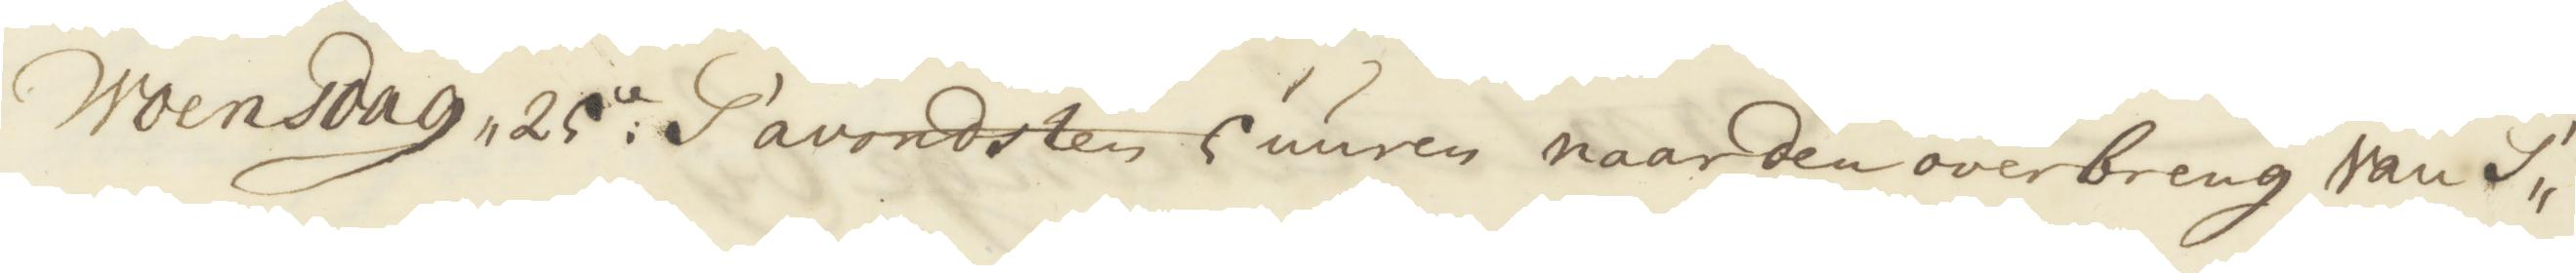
Woensdag „ 25:e s'avonds ten 5 uuren naar den overbreng van s„
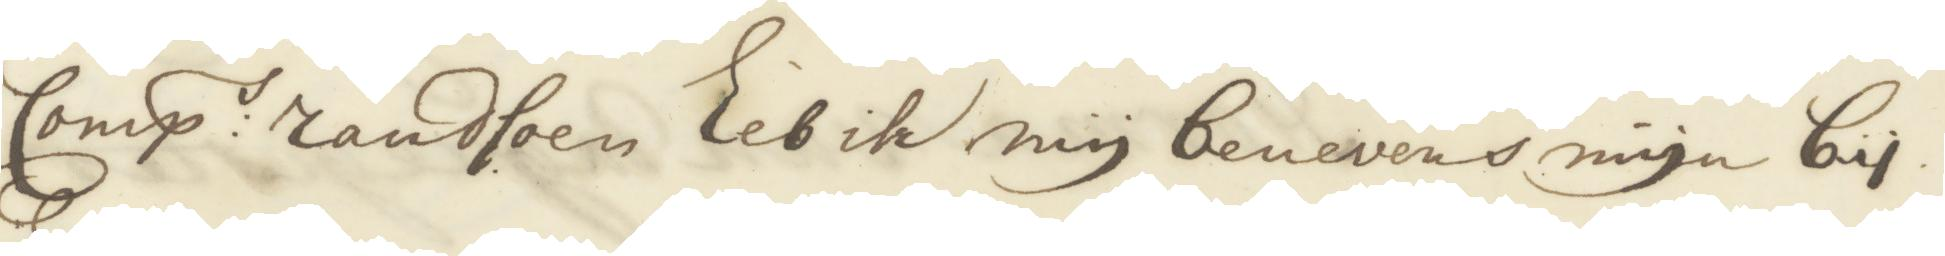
Comp:s randsoen heb ik mij benevens mijn bij
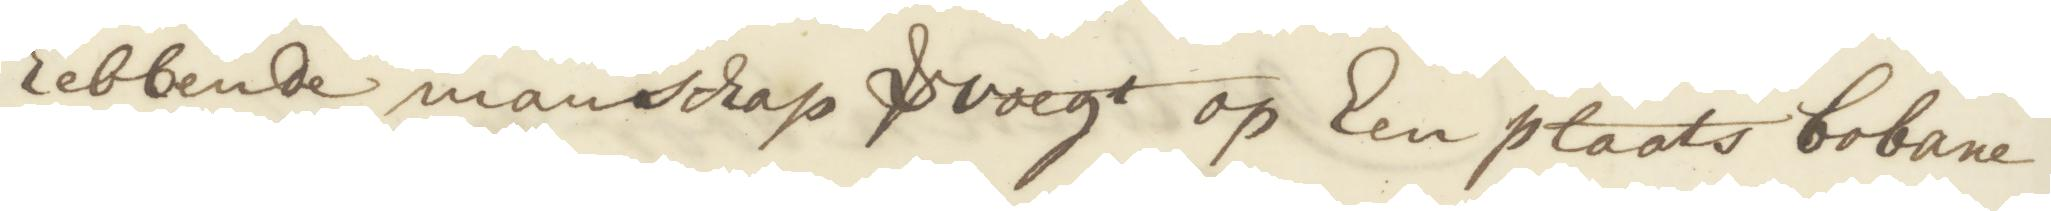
hebbende manschap vervoegt op Een plaats bobare
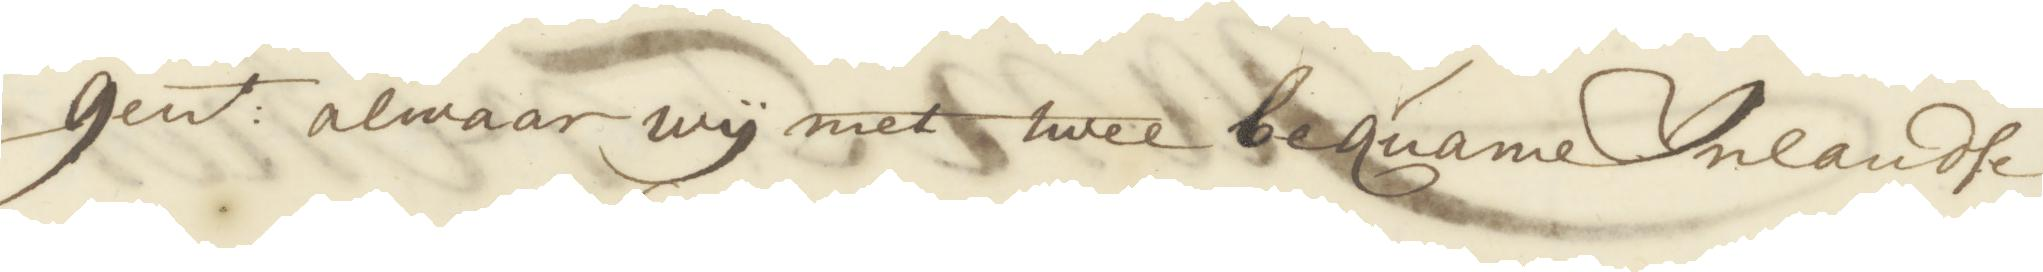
gen:t alwaar wij met twee bequame Inlandse
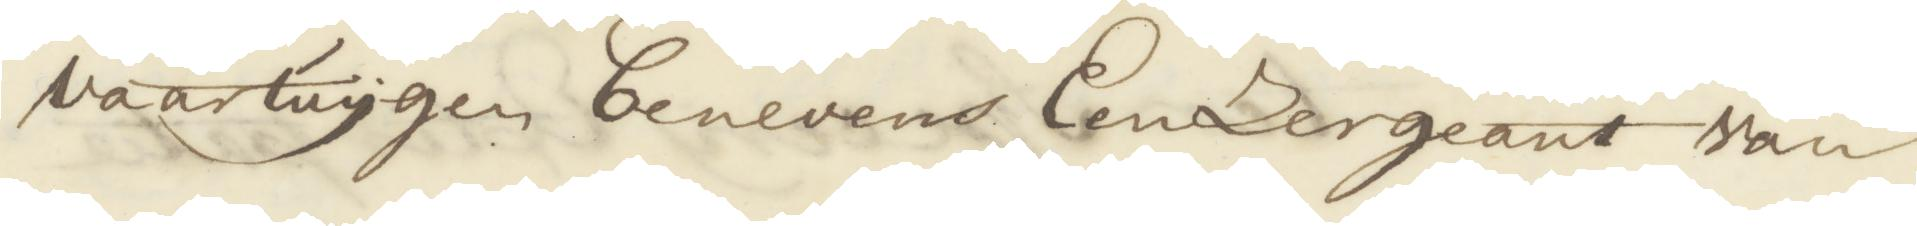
vaartuijgen benevens Een zergeant van
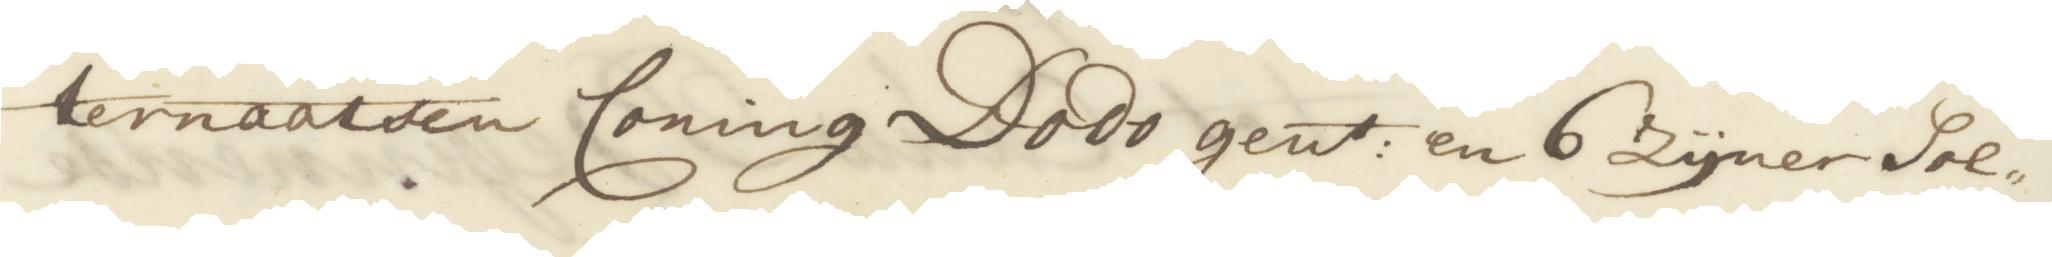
ternaatsen Coning Dodo gen:t en 6 zijner sol„
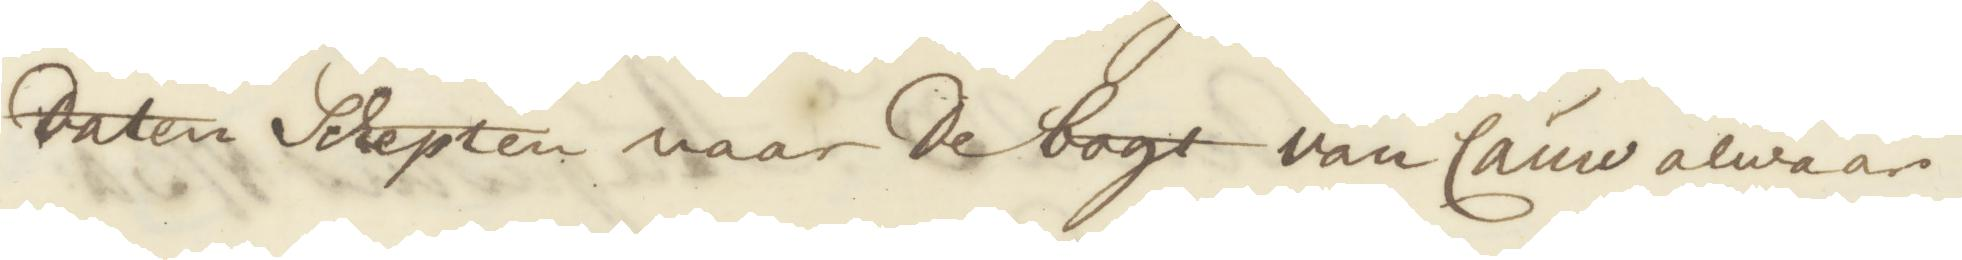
daten schepten naar de bogt van Cauw alwaar
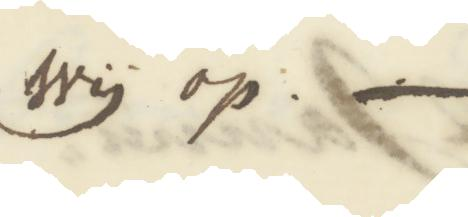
wij op. —
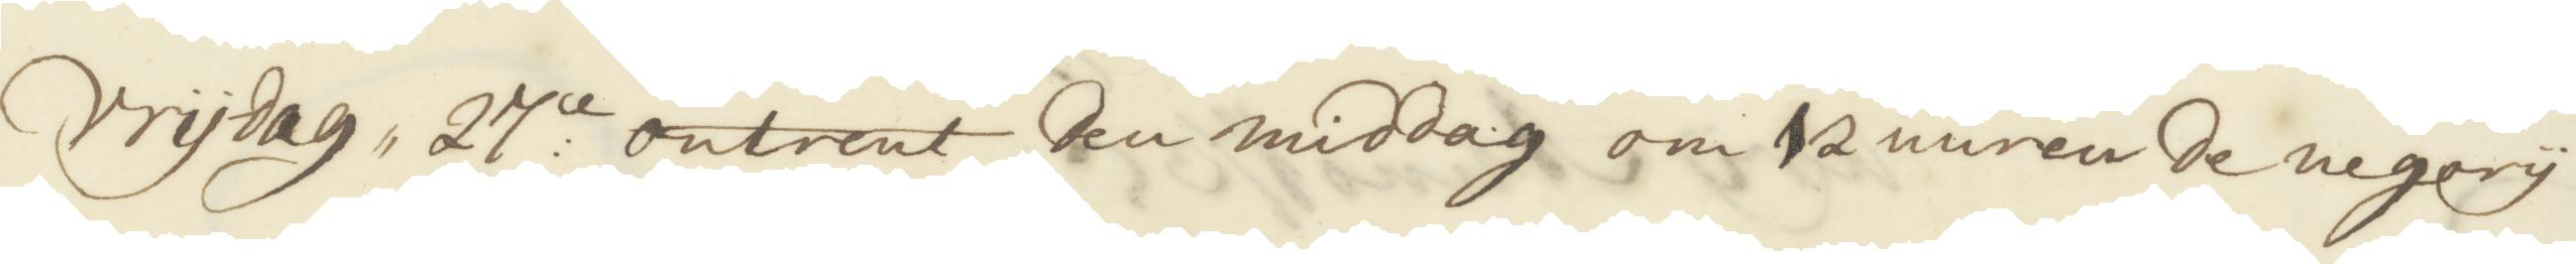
Vrijdag „ 27:e ontrent den middag om 12 uuren de negorij
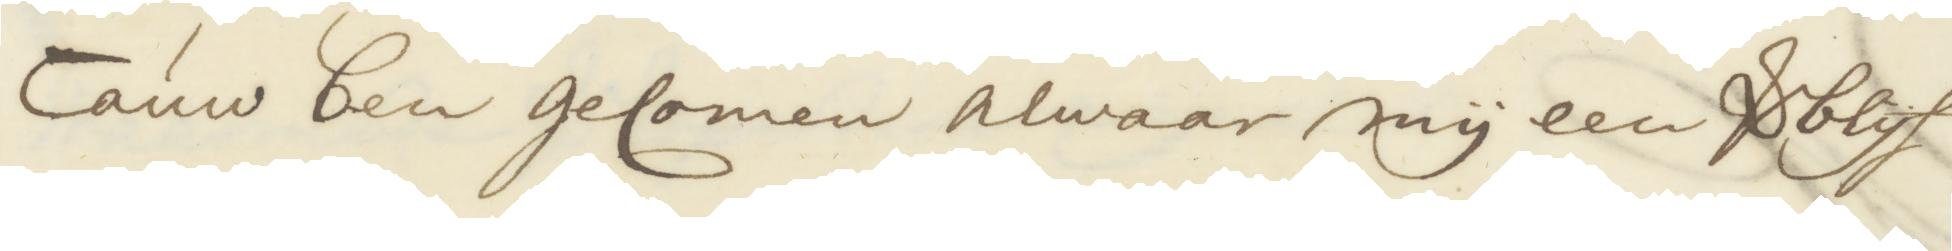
Cauw ben gecomen alwaar mij een verblijf
